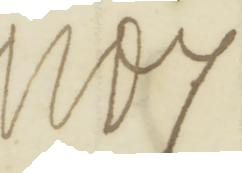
1107
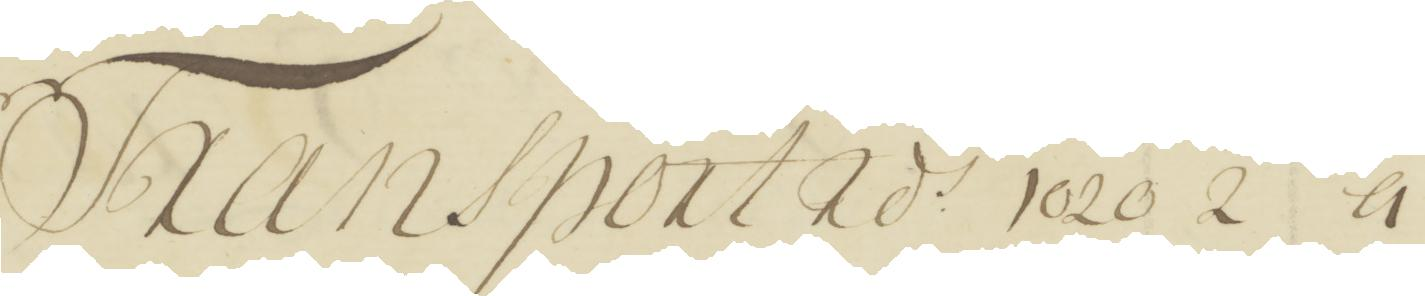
Transport rd:s 1020 2 4
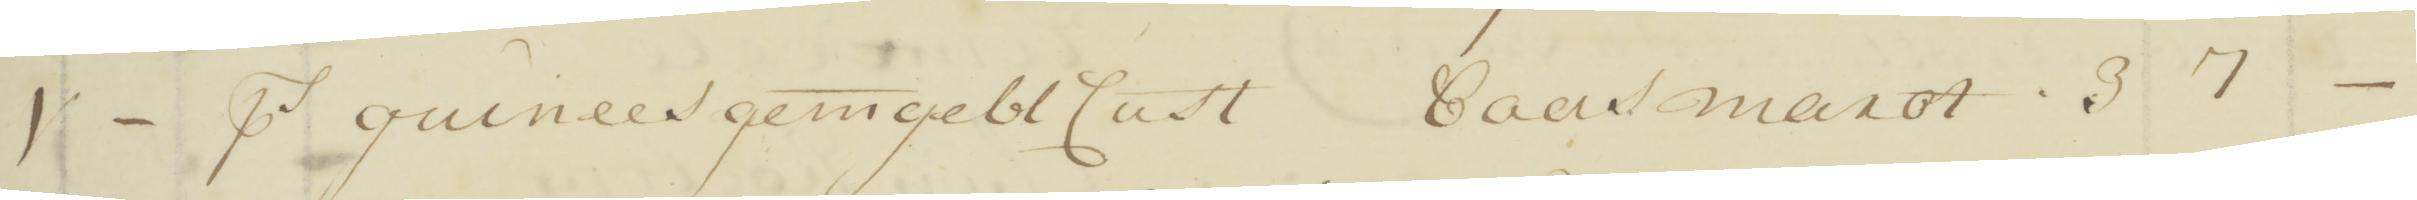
1 — ps quinees gem gebl Cust baasmarot 3 7 —
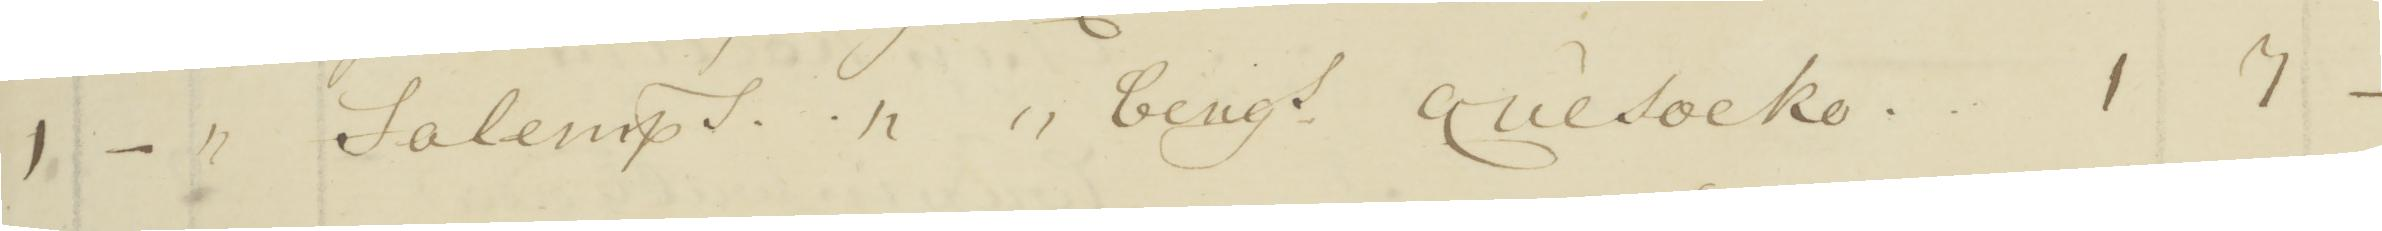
1 — „ Salemps . . „ „ berg-s quesoeko . . 1 7 —
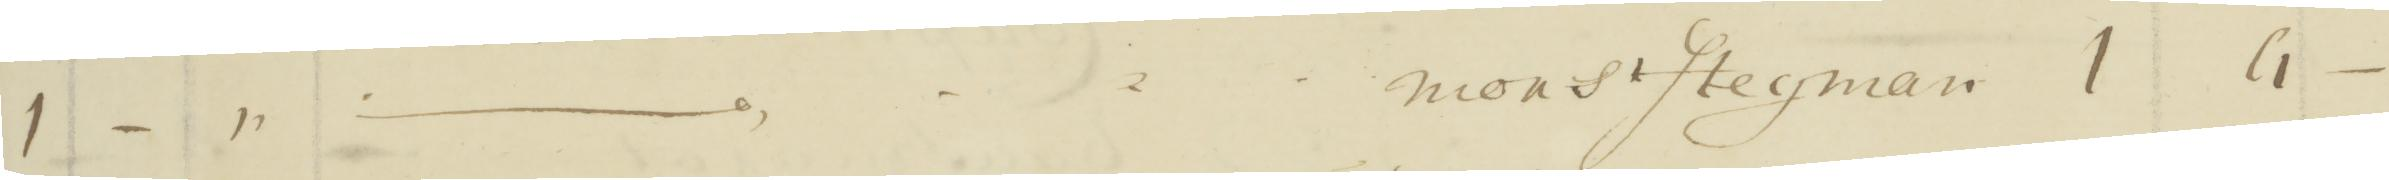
1 — „ _o - - - morst stegman 1 4 —
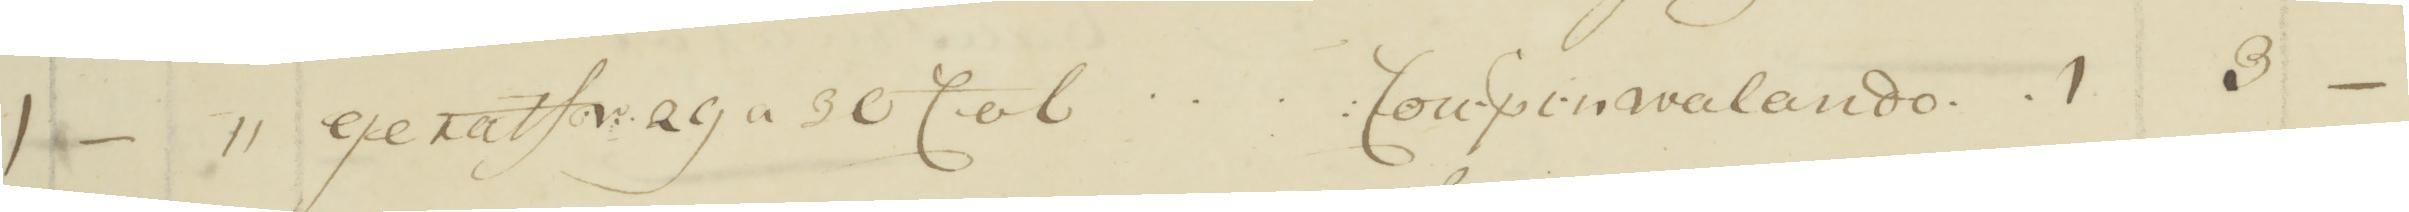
1 — „ geratsv: 29 a 30 Col . . . : Couponwalando. . 1 3 —
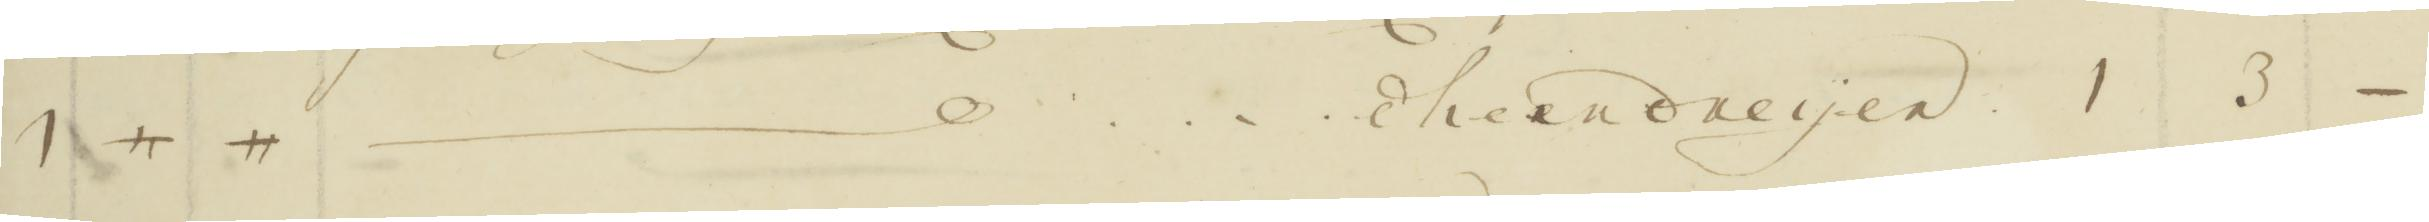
1 „ „ _o . . . . . . . dheerdreijer. 1 3 —
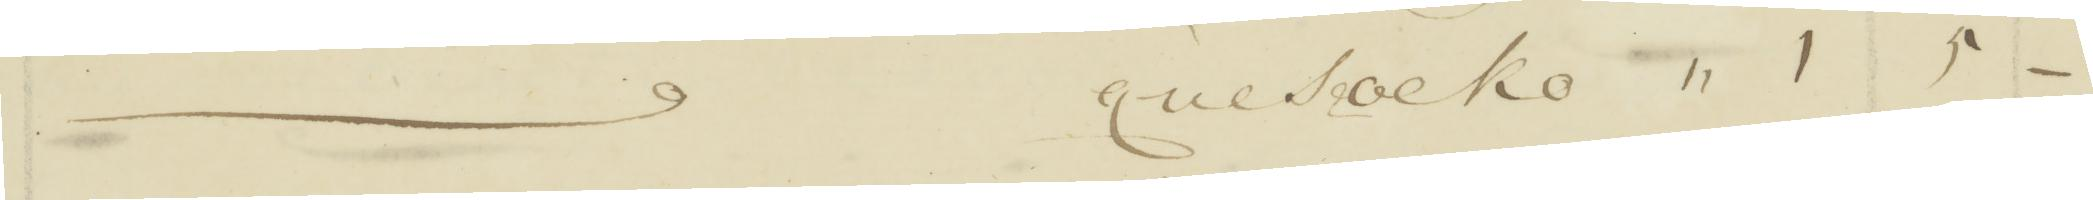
_o quesoeko „ 1 5 —
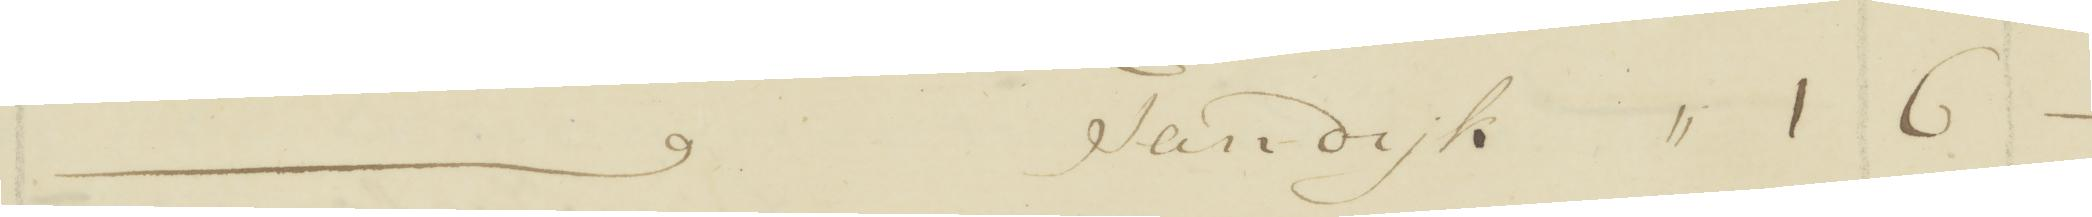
_o Ian dijk „ 1 6 —
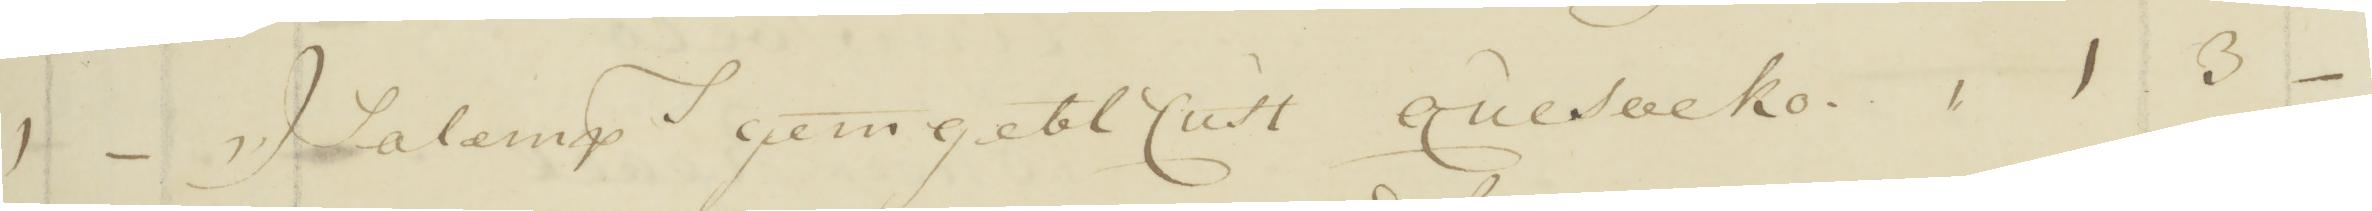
1 — Salemps gem gebl Cust quesoeko . . „ 1 3 —
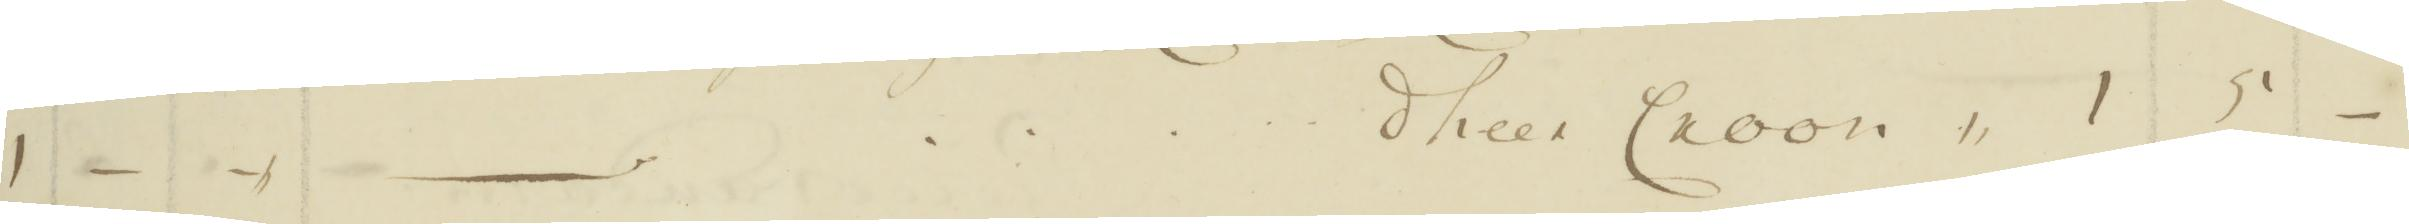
1 — —„ _o . . . . . dheer Croon „ 1 5 —
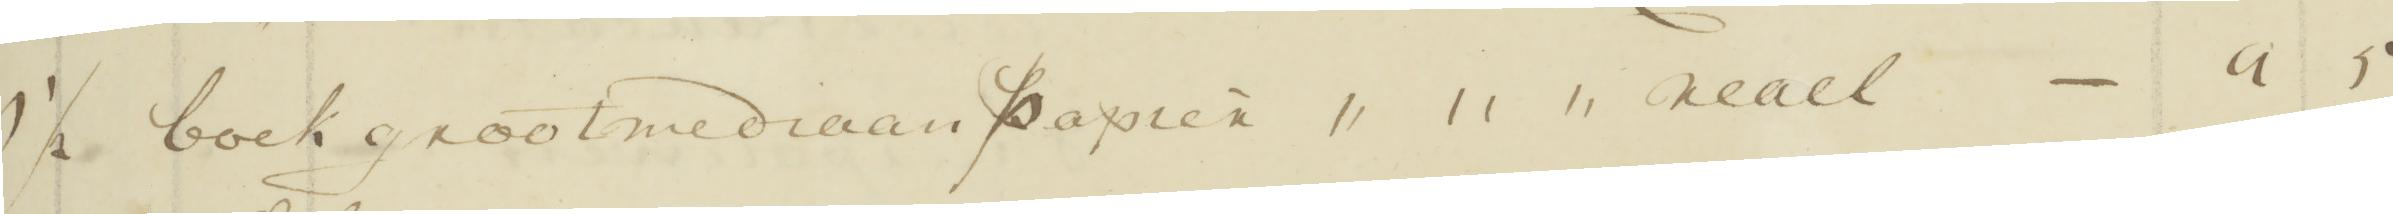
1½ boek groot mediaan papier „ „ „ reael — 4 5
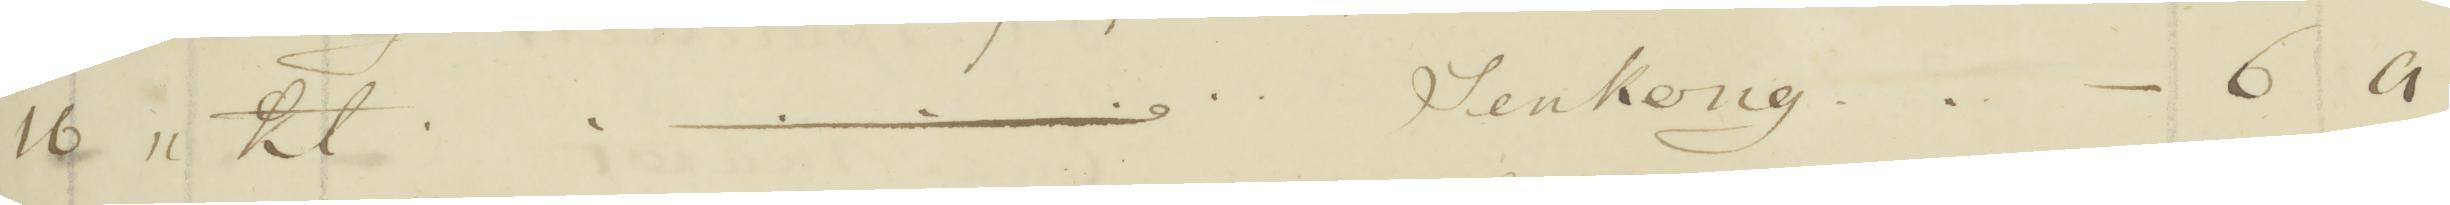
16 „ kl . . . . . _o . . Senkong . . . — 6 4
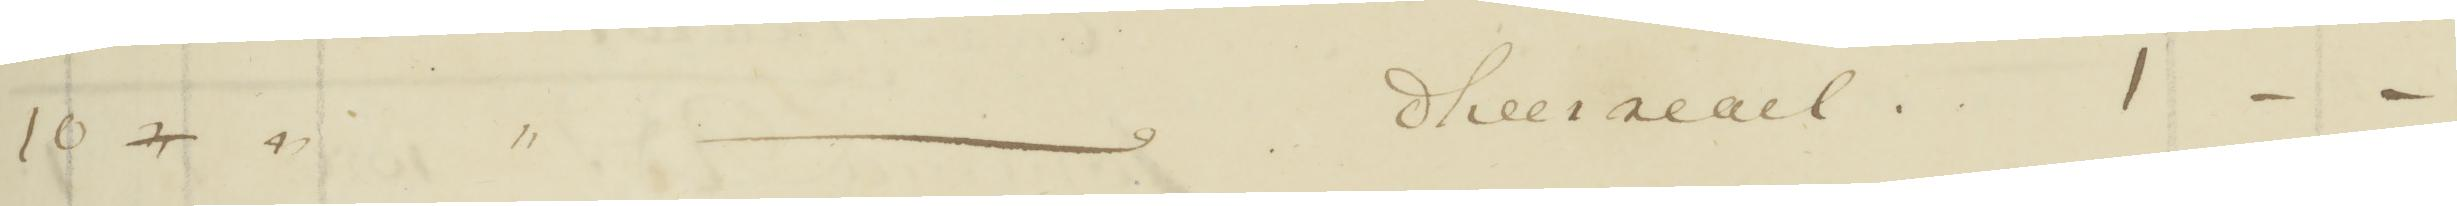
10 — „ „ _o . . dheer reael . . 1 — —
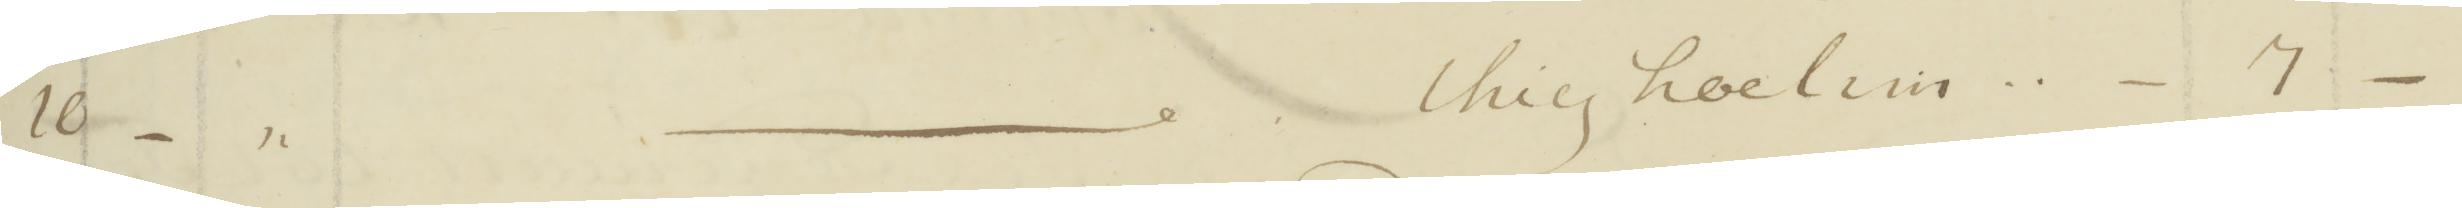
10 — „ _o . thien hoelim . . — 7 —
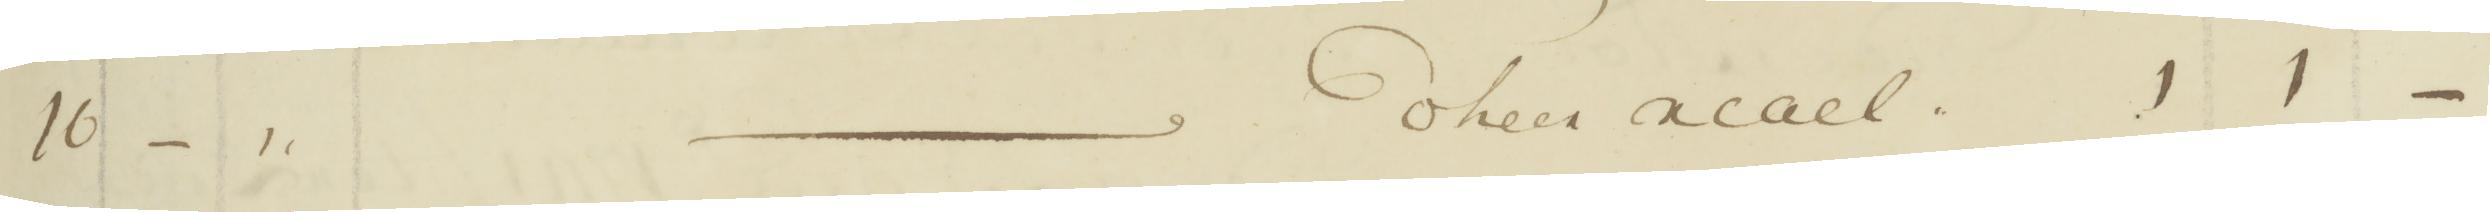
10 — „ _o dheer reael „ 1 1 —
